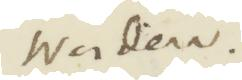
werden.
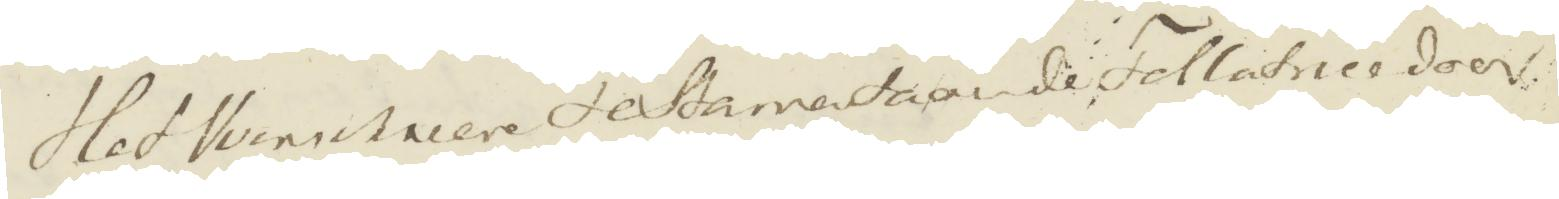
Het Vuerschreeve Testament aan de Testatrice door
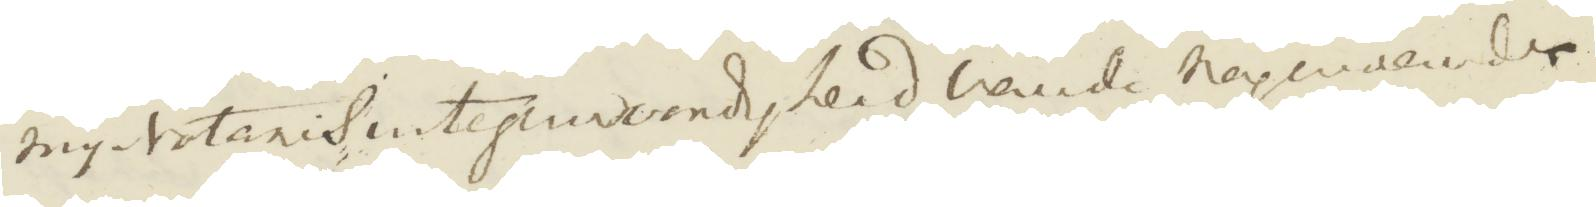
my Notaris in tegenwoordigheid vande nagenoemder
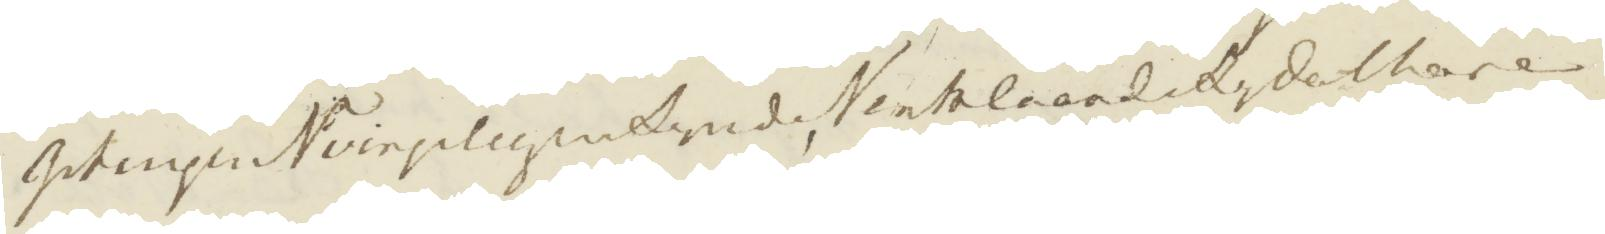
getuigen Vuirgelezen synde, Verklaarde Zy dat hare
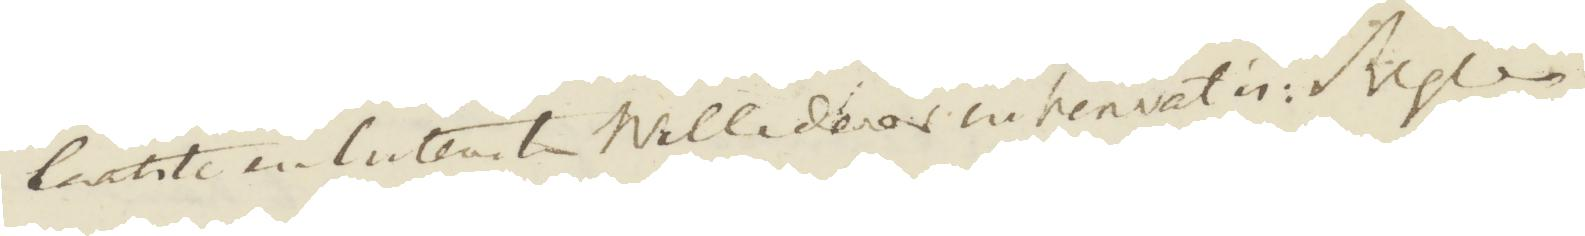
laatste en uiterste Wille daar in vervat is: Bege
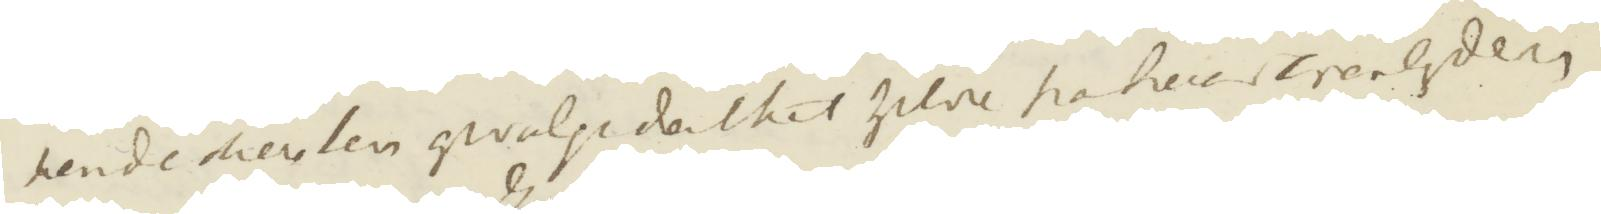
rende dien ten gevolge dat het zelve na haar overlyden
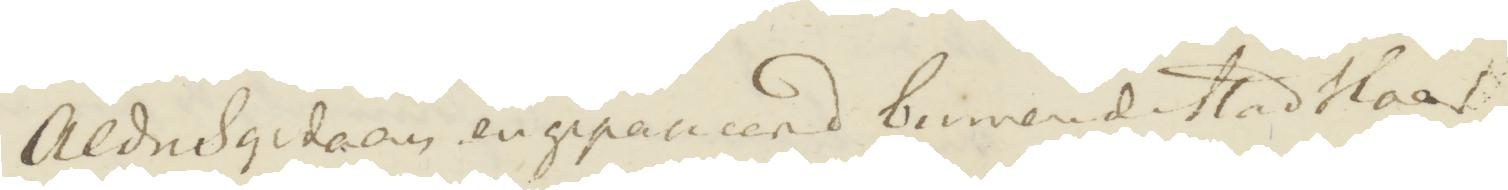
Aldus gedaan en gepasseerd binnen de stad Haar
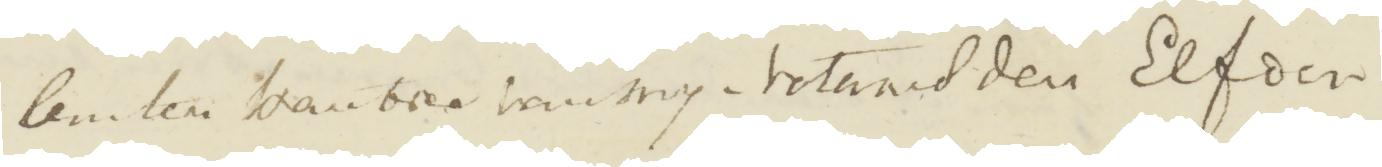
lem ten kantore van my Notaris den Elfder
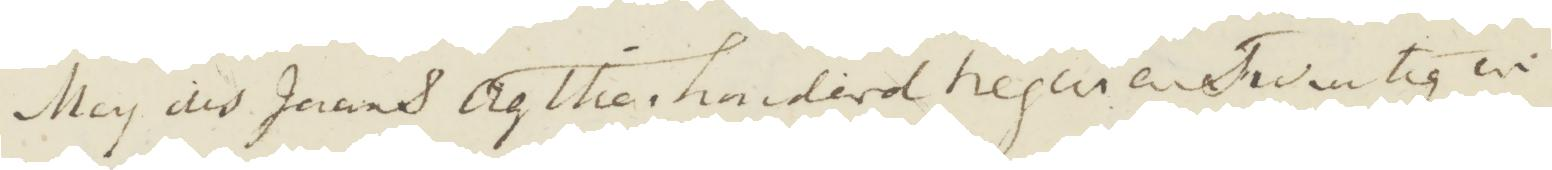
Mey des Jaars Agttien honderd negen en Twintig in
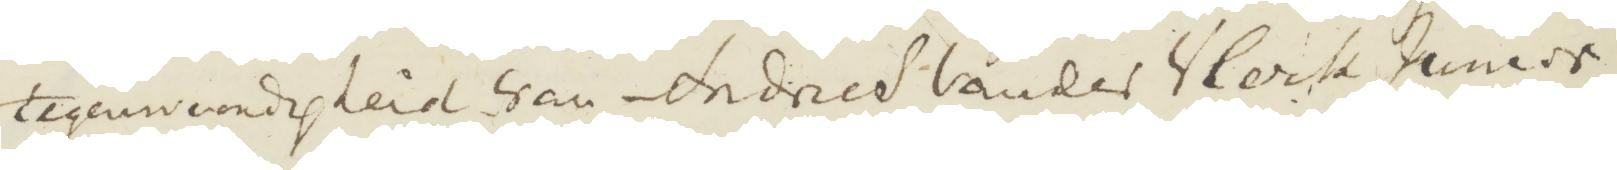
tegenwoordigheid van Andries Van der Vlerk Junior,
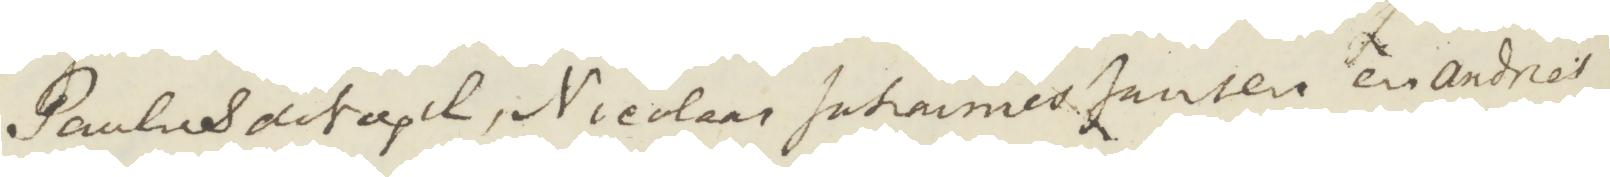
Paulus de Vogel, Nicolaas Johannes Jansen en Andries
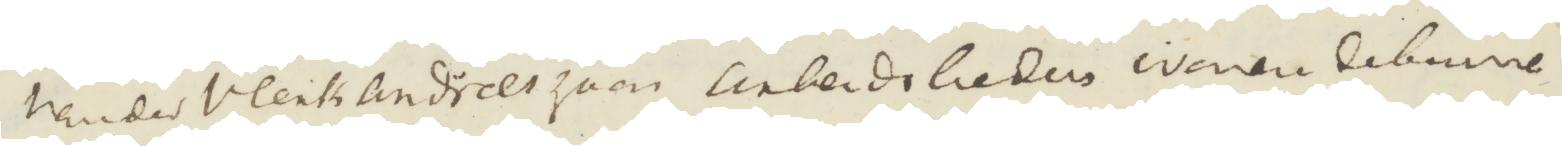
van der Vlerk Andrieszoon, arbeidslieden wonende binne
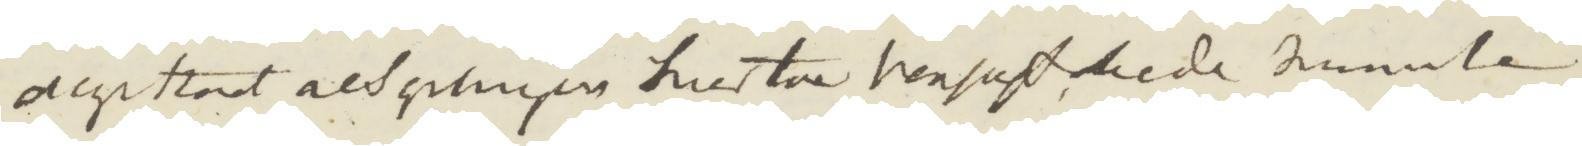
deze stad als getuigen hier toe versogt, die de minute
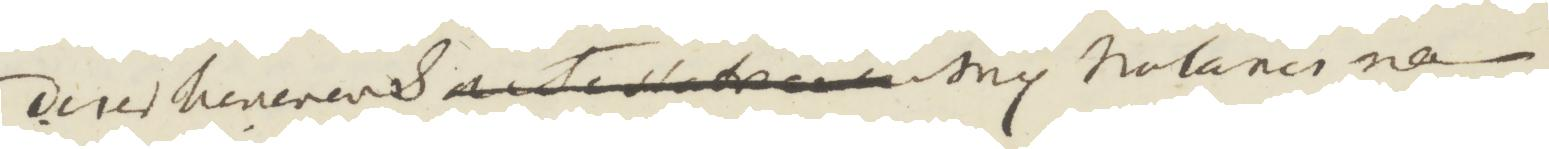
dezes benevens de Testatrice my Notaris na
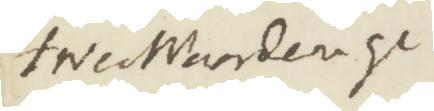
twee Woorden ge
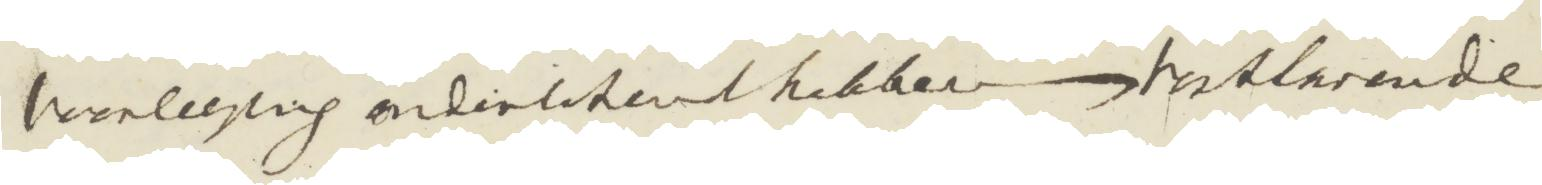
voorleezing ondertekent hebben Verklarende
